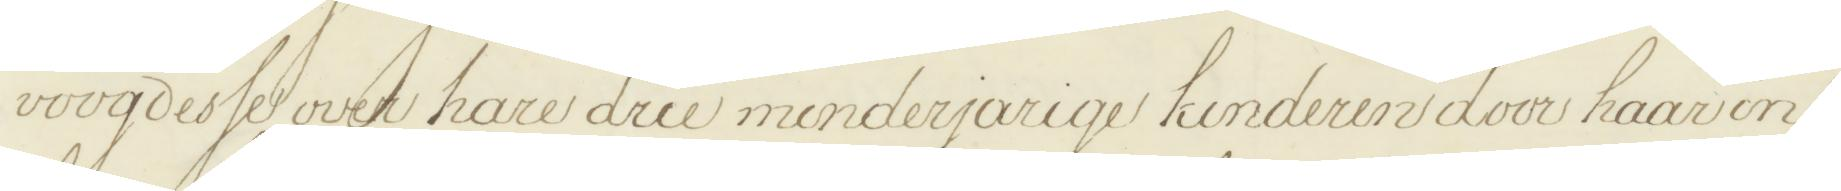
voogdesse over hare drie minderjarige kinderen door haar in
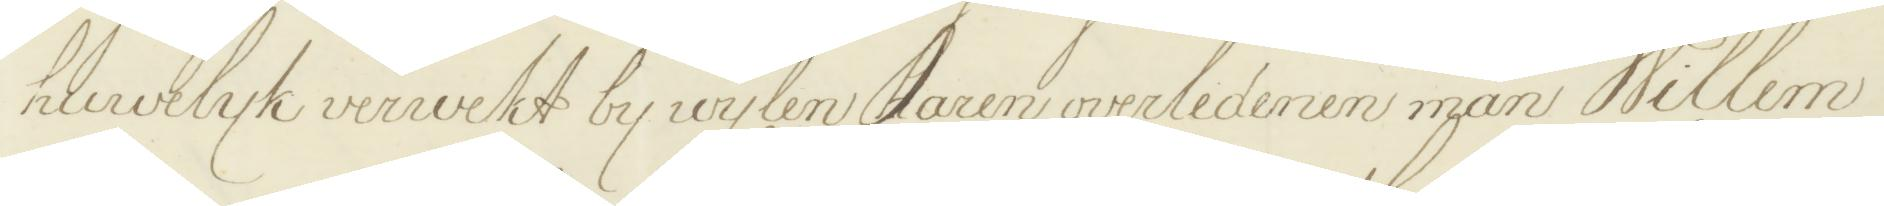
huwelyk verwekt by wylen haren overledenen man Willem
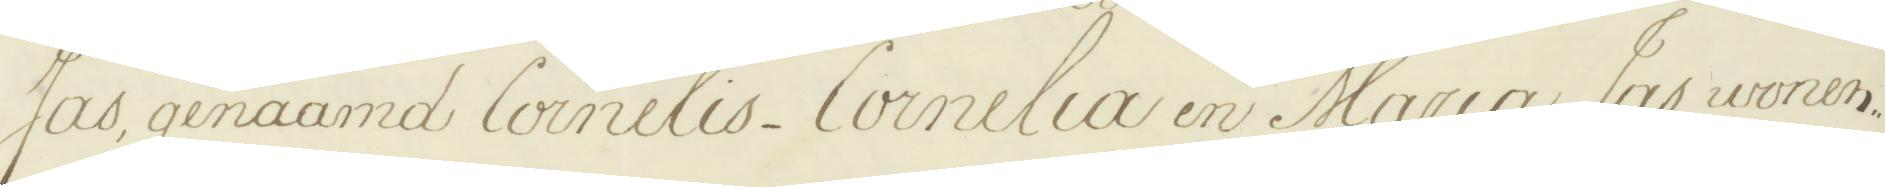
Jas, genaamd Cornelis - Cornelia en Maria Jas, wonen„
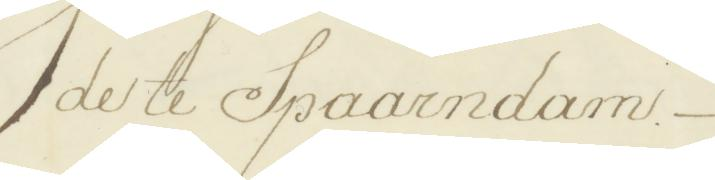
de te Spaarndam.
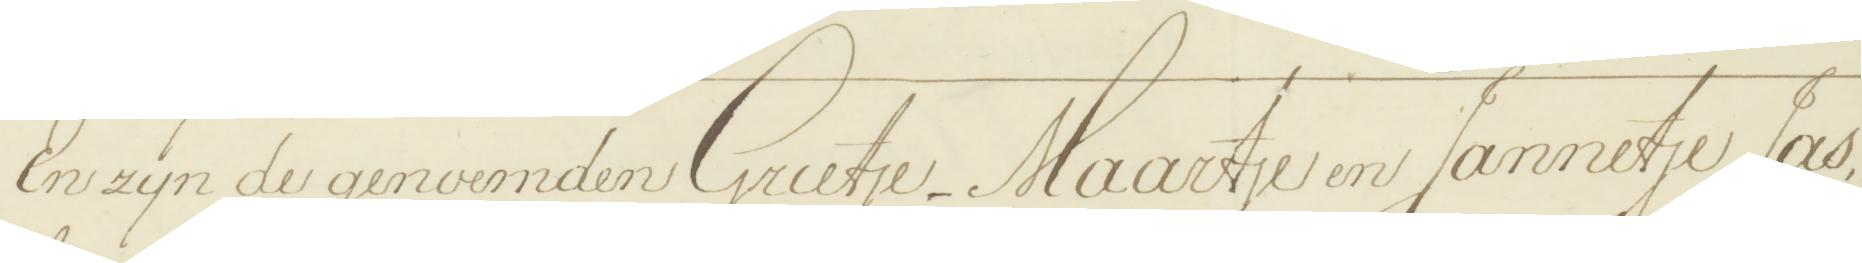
En zyn de genoemden Grietje Maartje en Jannetje Jas,
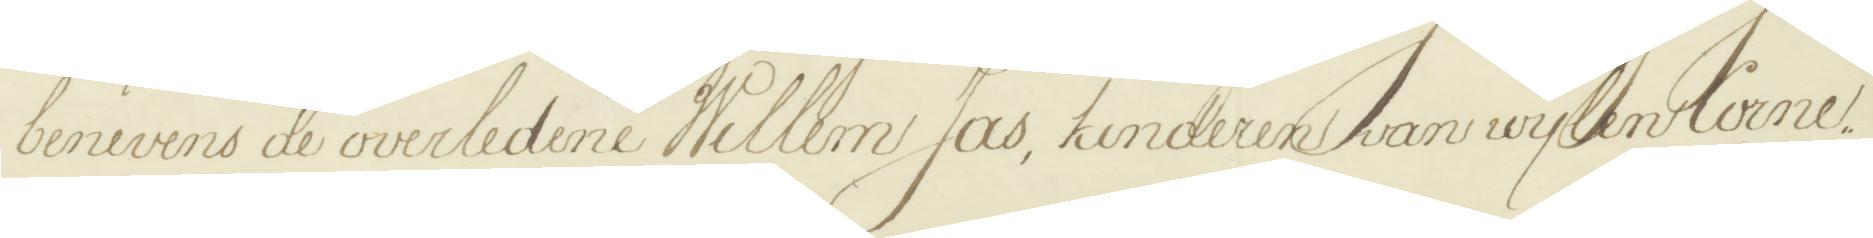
benevens de overledene Willem Jas, kinderen van wylen Corne„
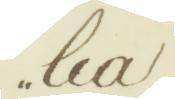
„lia
